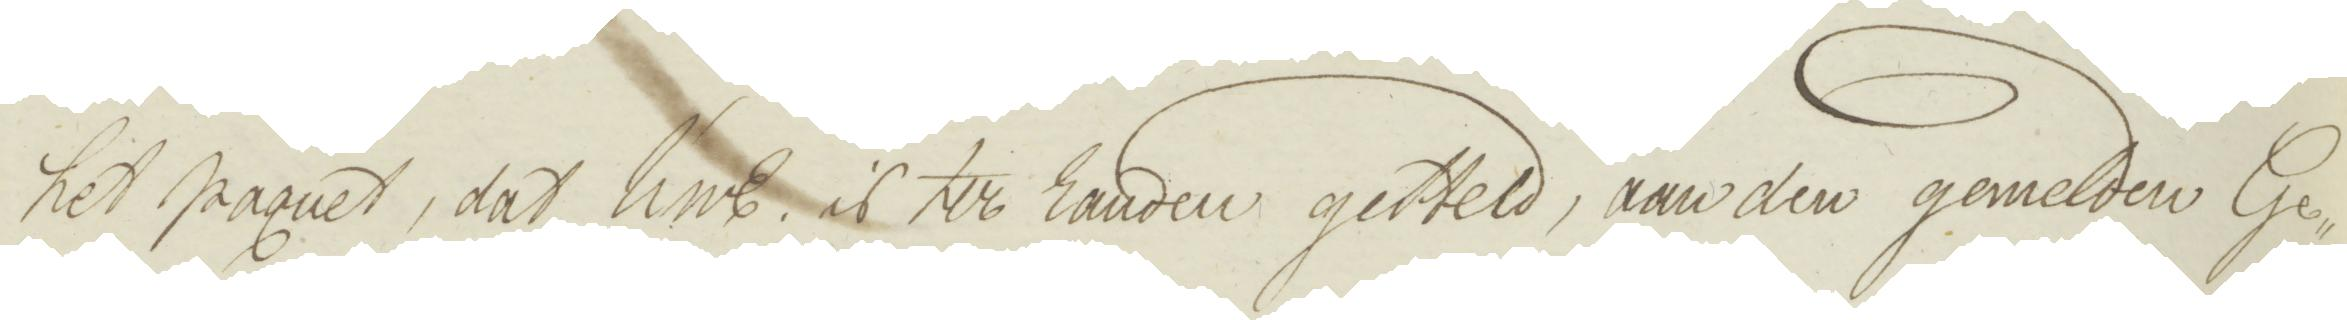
het paquet, dat UwE. is ter handen gesteld, aan den gemelden Ge„
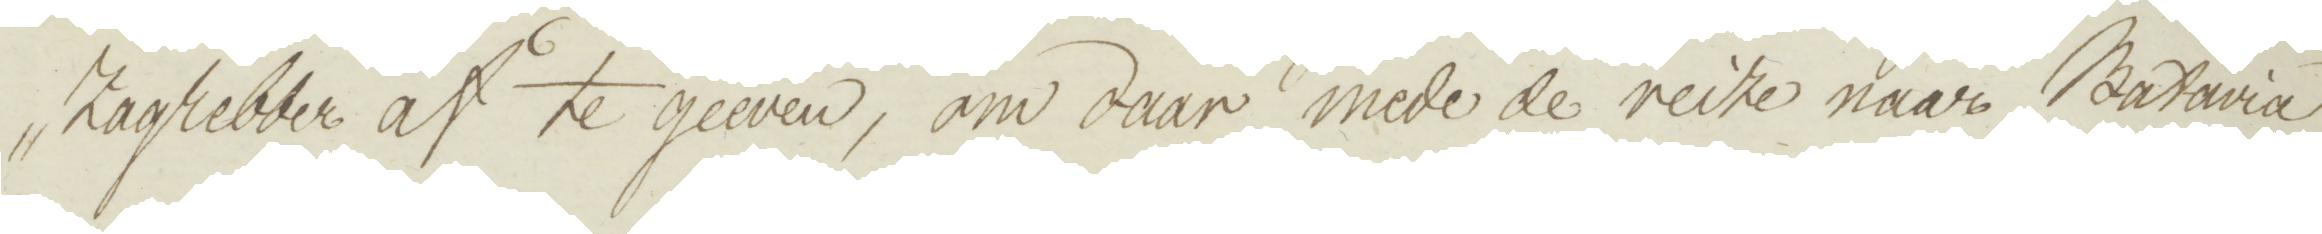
„Zaghebber af te geeven, om daar mede de reize naar Batavia
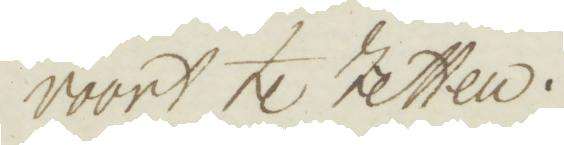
voort te zetten.
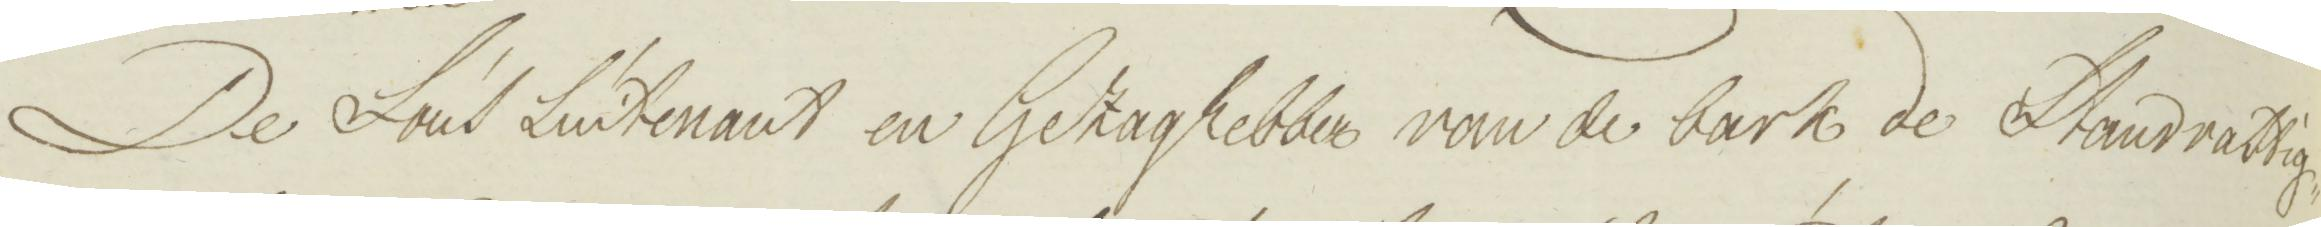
De Sous Luitenant en Gezaghebber van de bark de Standvastig„
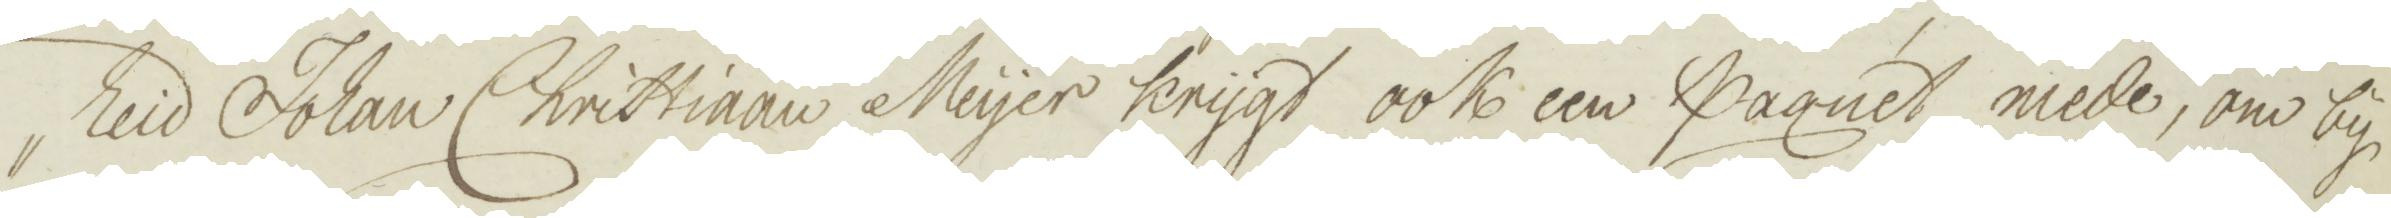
„heid Iohan Christiaan Meijer krijgt ook een paquet mede, om bij
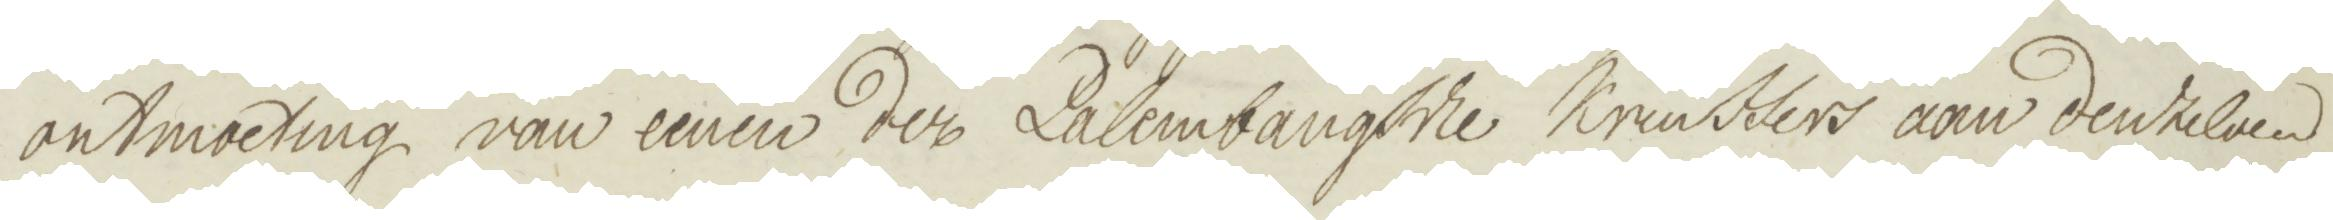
ontmoeting van eenen der Palembangsche Kruissers aan denzelven
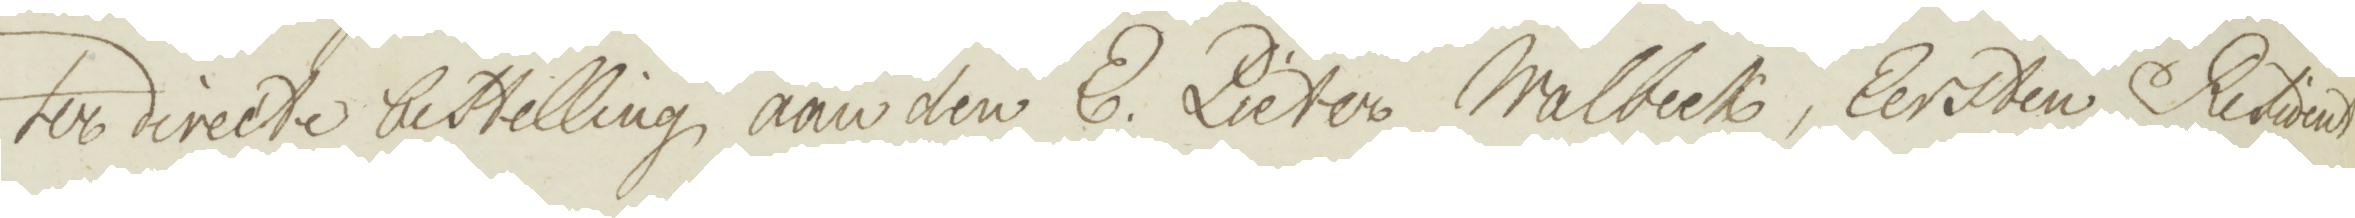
ter directe bestelling aan den E. Pieter Walbeek, Eersten Resident
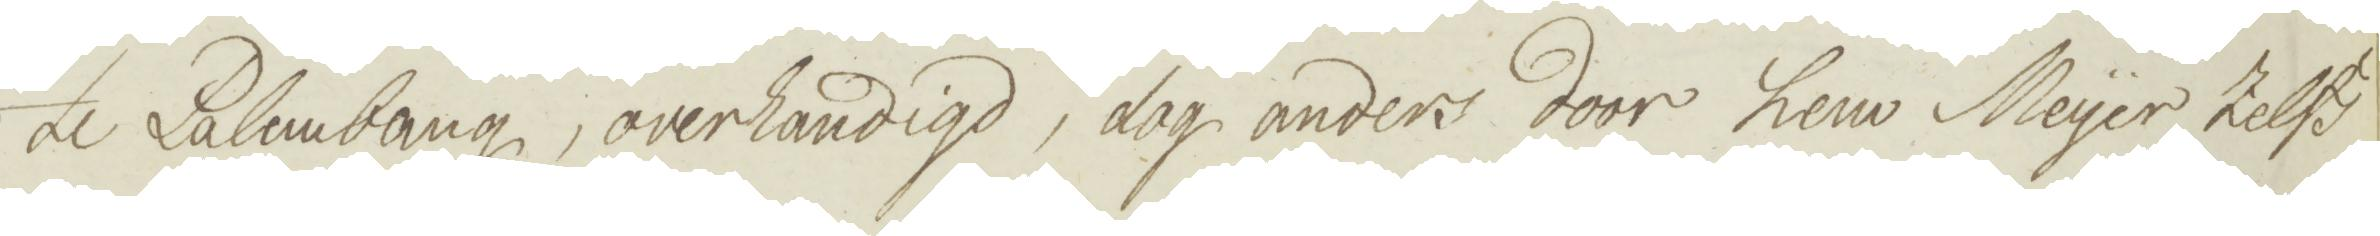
te Palembang, overhandigd, dog anders door hem Meijer Zelfs
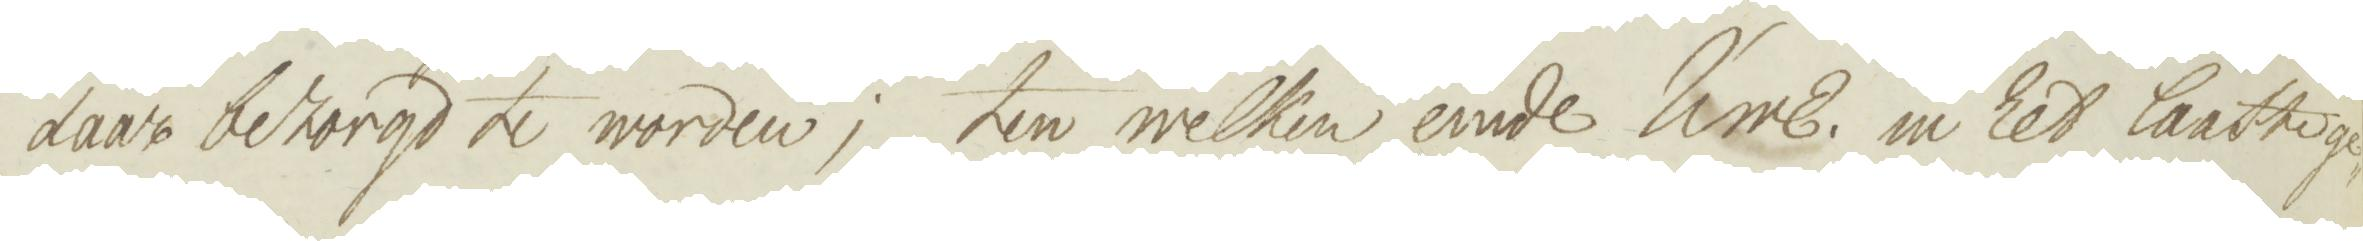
daar bezorgd te worden; ten welken einde UwE. in het laaste ge„
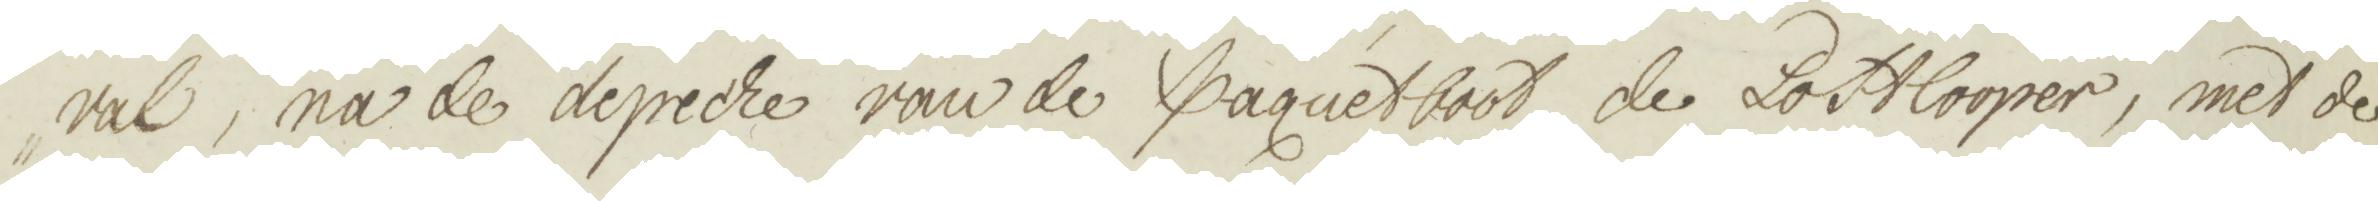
„val, na de depeche van de paquetboot de Postlooper, met de
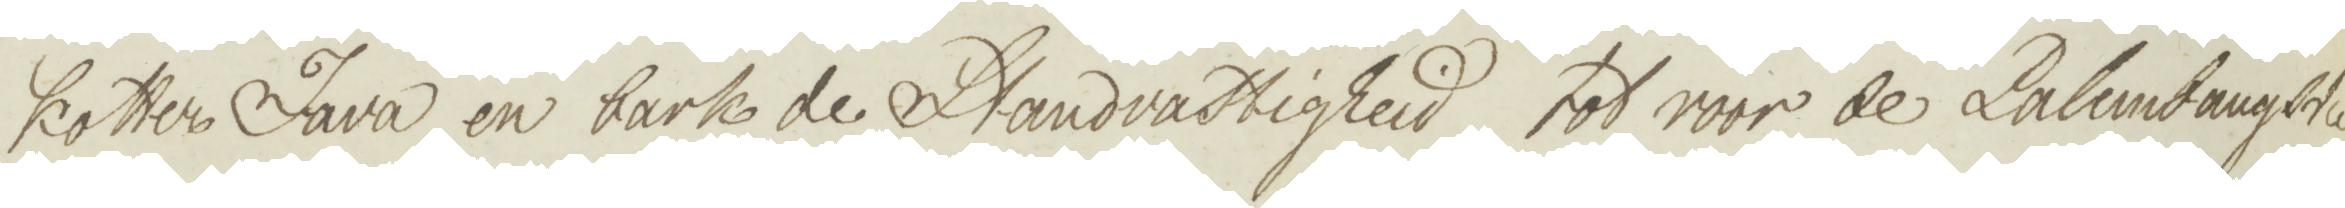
kotter Iava en bark de Standvastigheid tot voor de Palembangsche
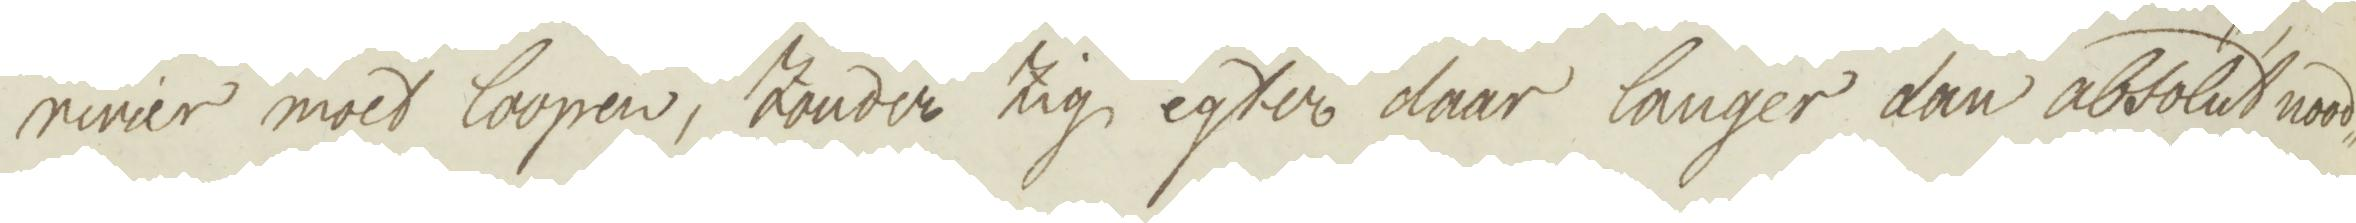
rivier moet loopen, Zonder zig egter daar langer dan absolut nood„
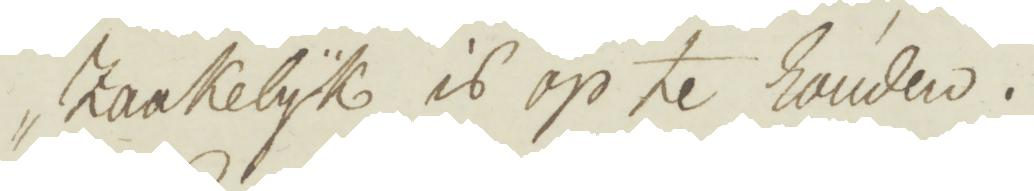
„Zaakelijk is op te houden.
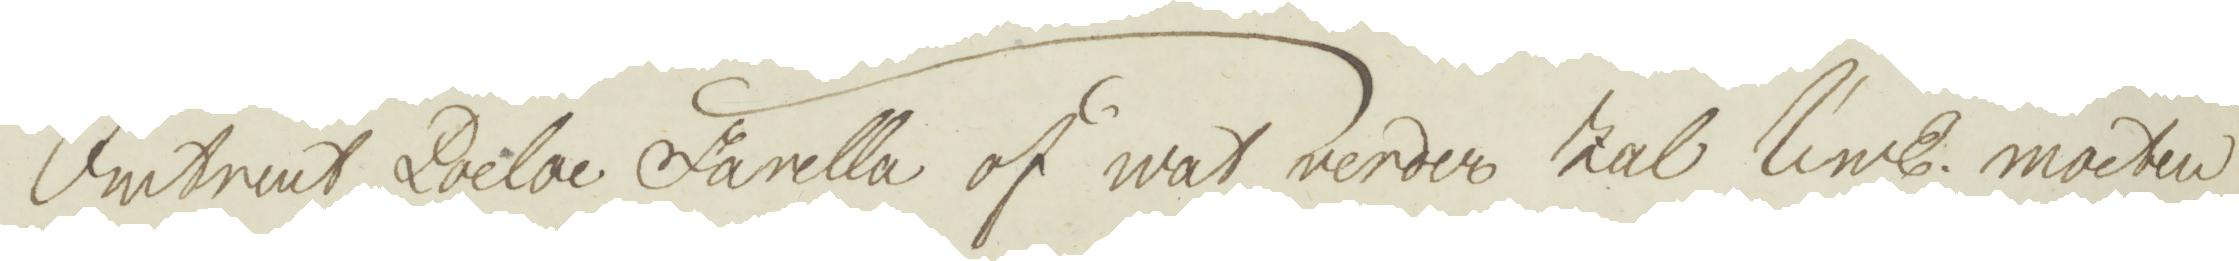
Omtrent Poeloe Favella of wat verder Zal UwE. moeten
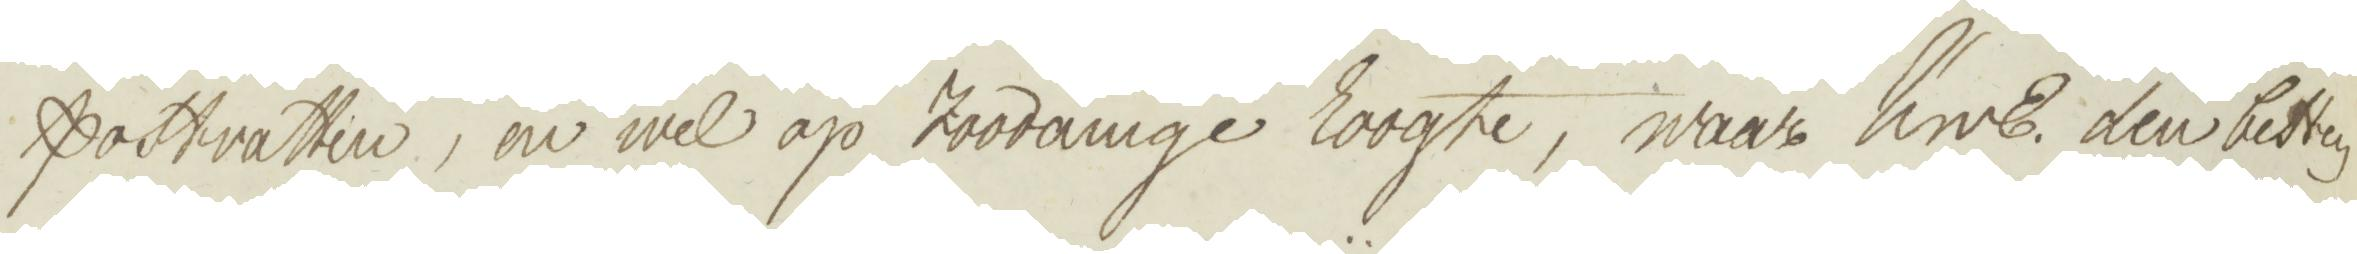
postvatten, en wel op zoodanige hoogte, waar UwE. den besten
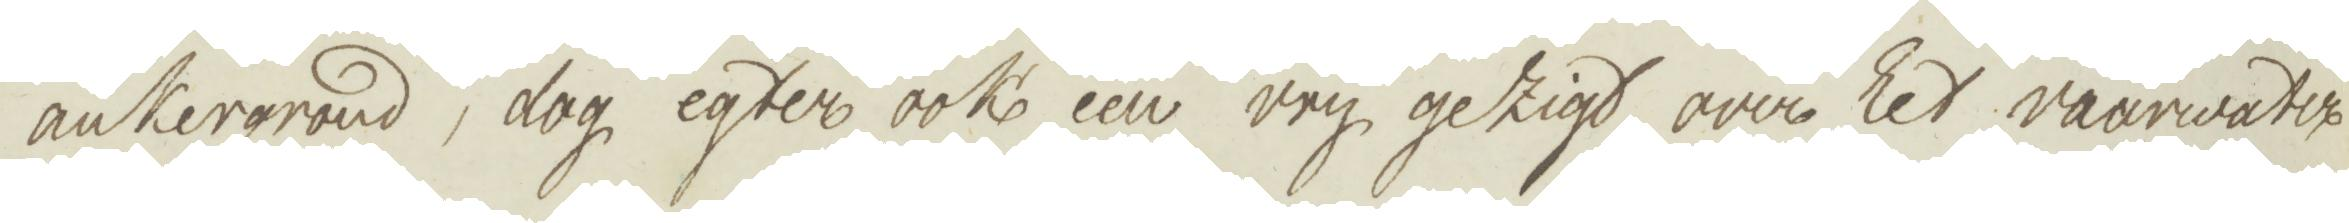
ankergrond, dog egter ook een vrij gezigt over het vaarwater
